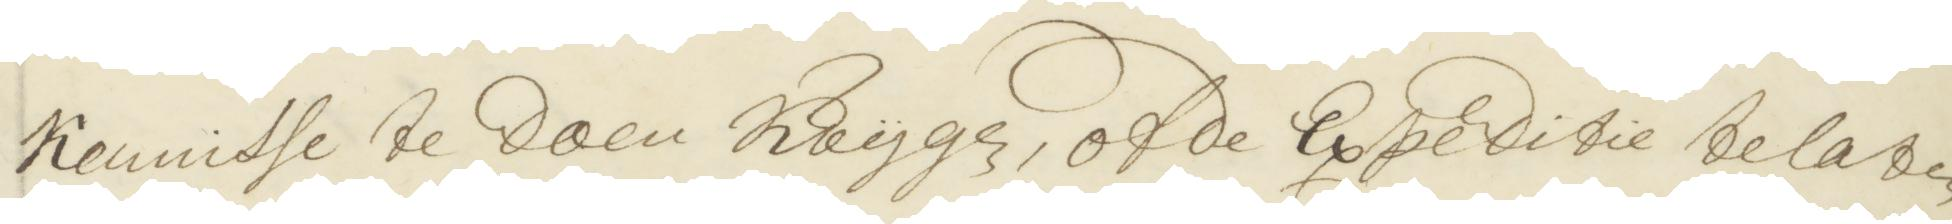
kennisse te doen krijgen, of de Expeditie te laten
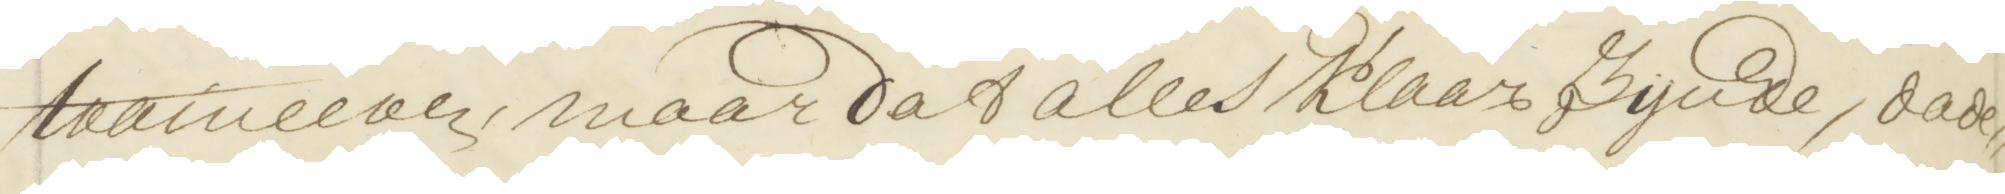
traineeren, maar dat alles klaar zijnde, dade„
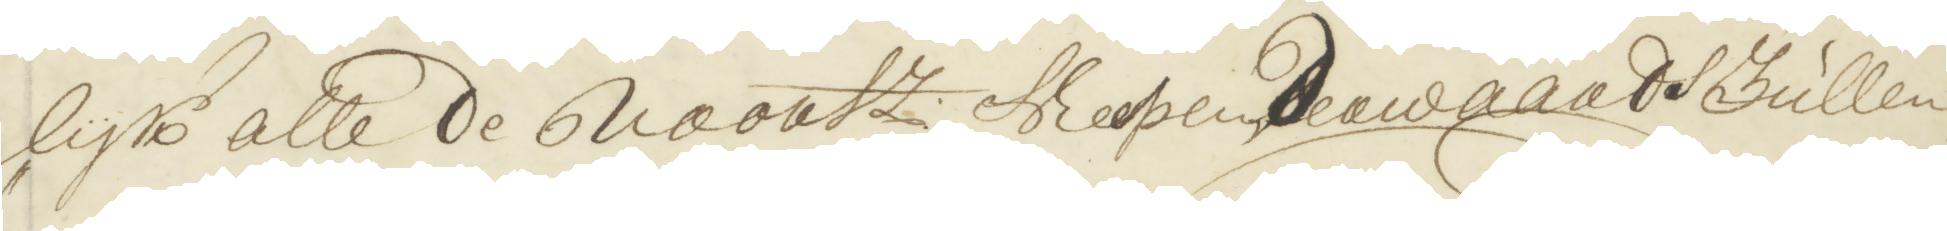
„lijk alle de voorsz: scheepen derwaards zullen
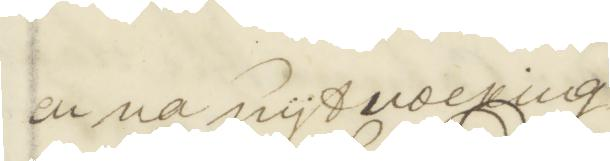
en na uijtvoering
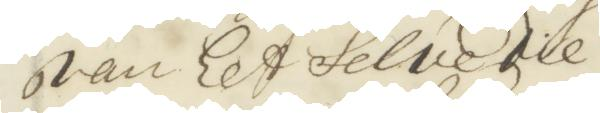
van het selve die
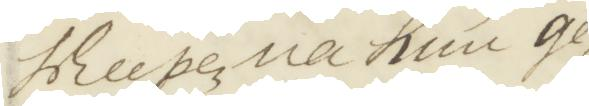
scheepen na hun ge
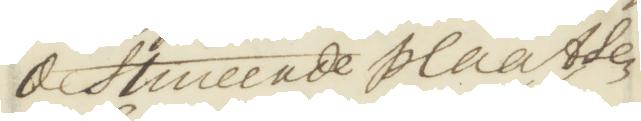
destineerde plaatsen
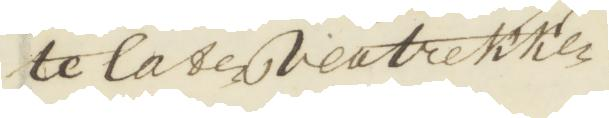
te laten vertrekken
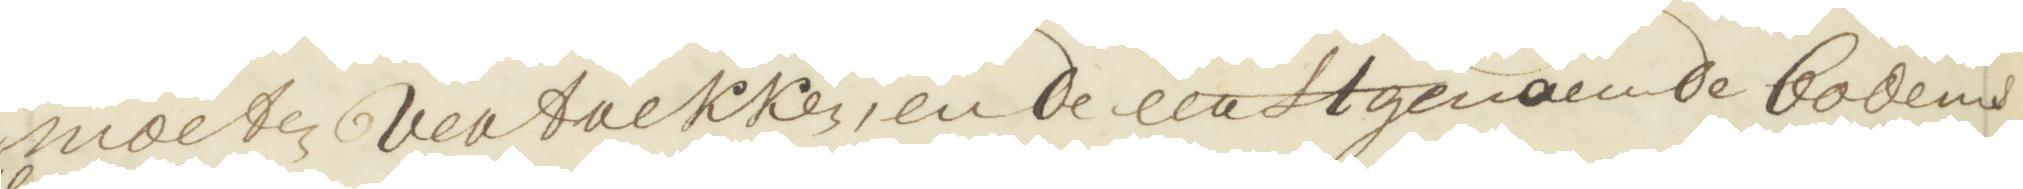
moeten vertrekken, en de eerstgenoemde bodems
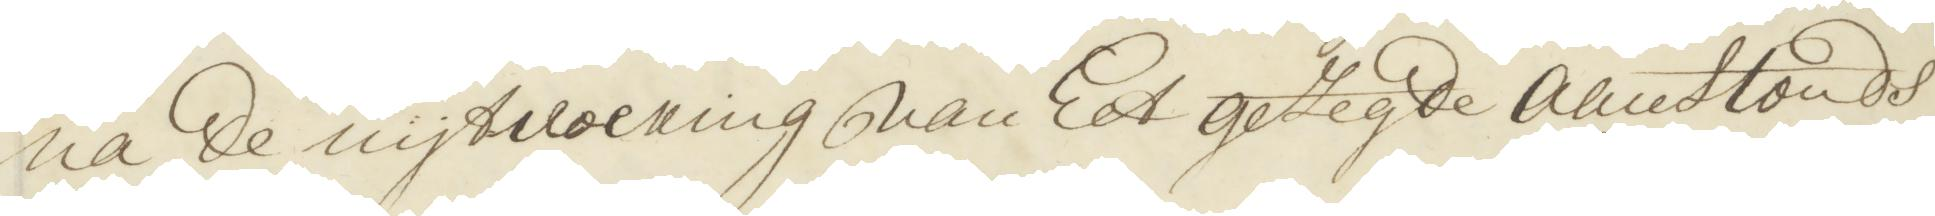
na de uijtvoering van het gezegde aanstonds
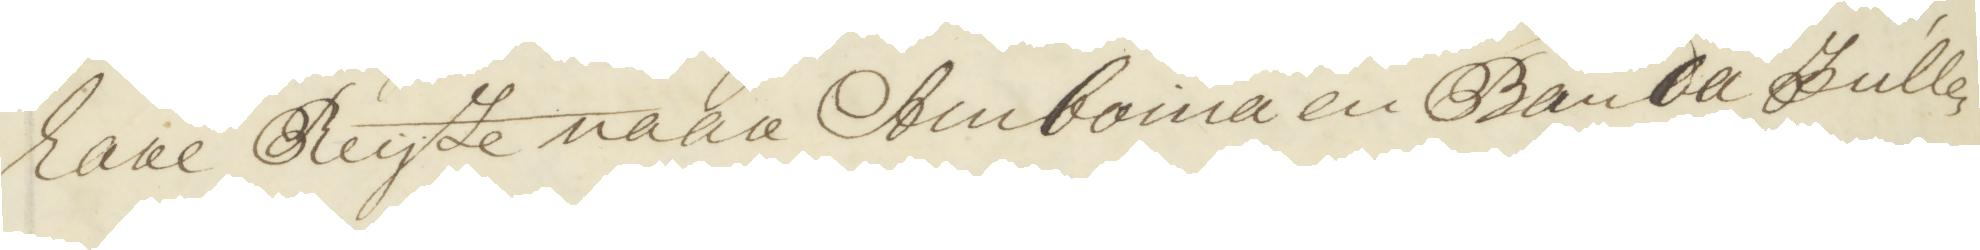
hare Reijze naar Amboina en Banda zullen
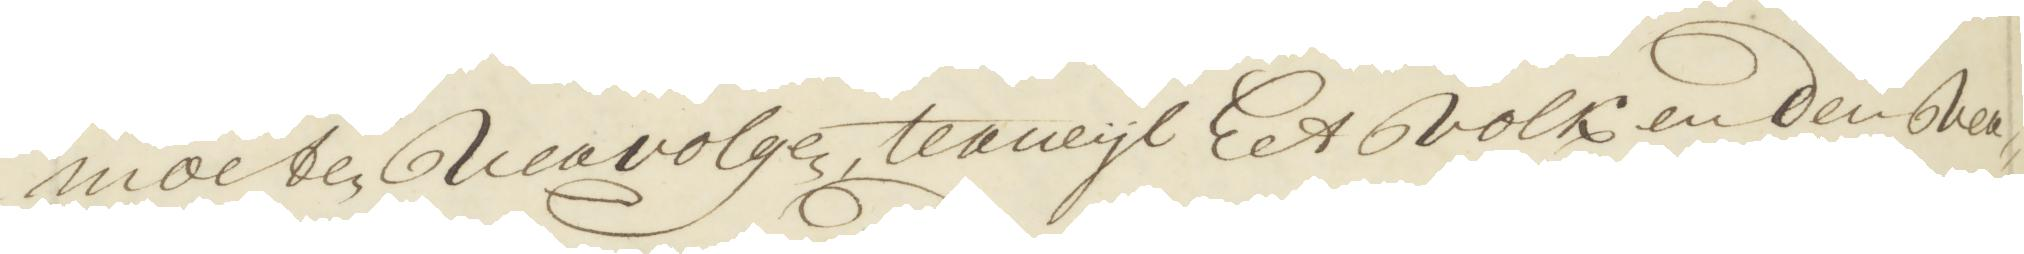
moeten vervolgen, terweijl het volk en den ver„
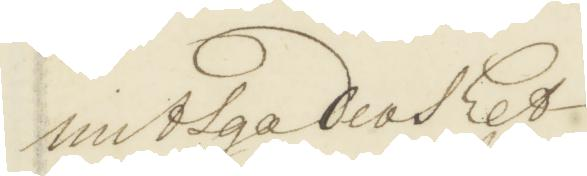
mitsgaders het
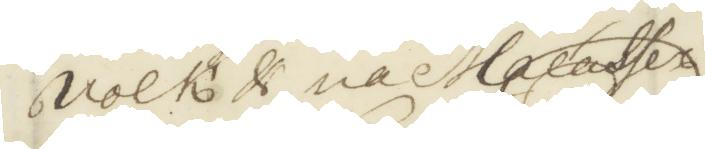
volk & na Macasser
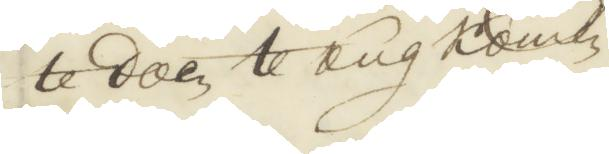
te doen te rug komen
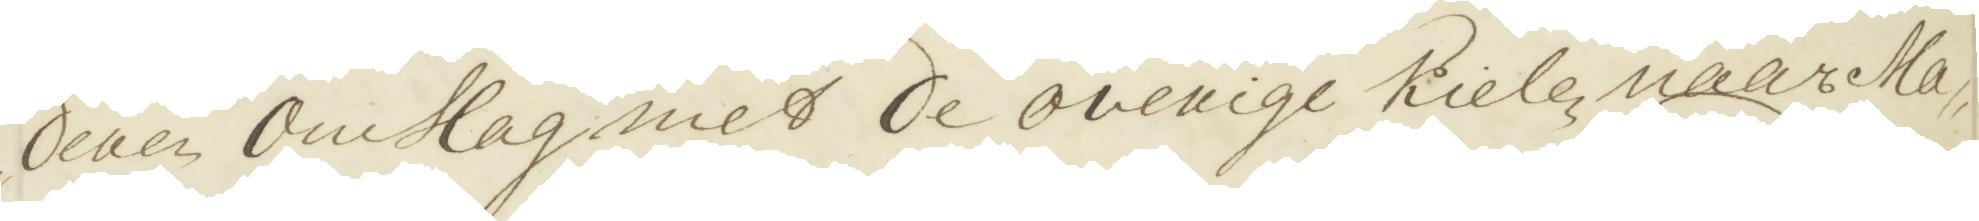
deren omslag met de overige kielen naar Ma„
